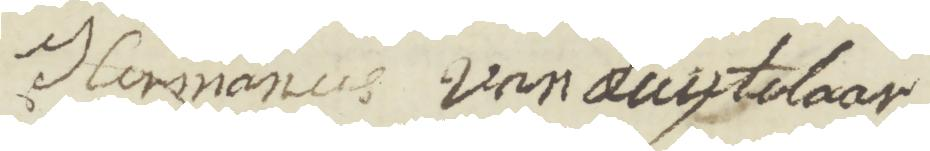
Hermanus van Luijtelaar
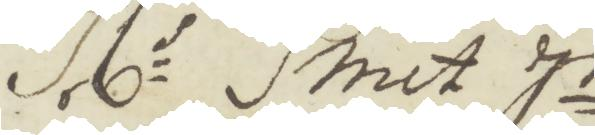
H=s Smit J=r
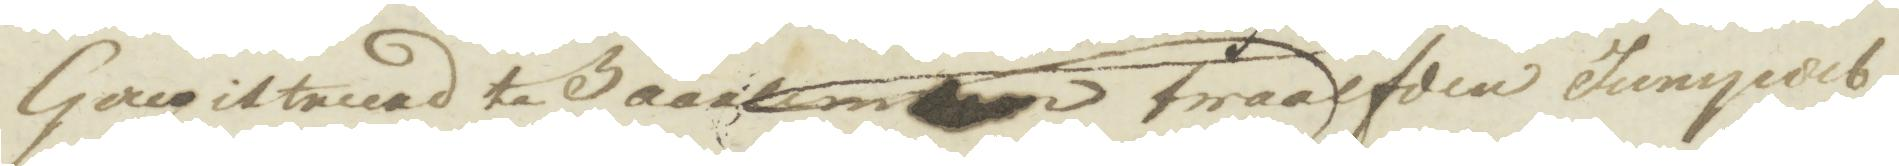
Geregistreerd te Haarlem den twaalfden Iuni 1816
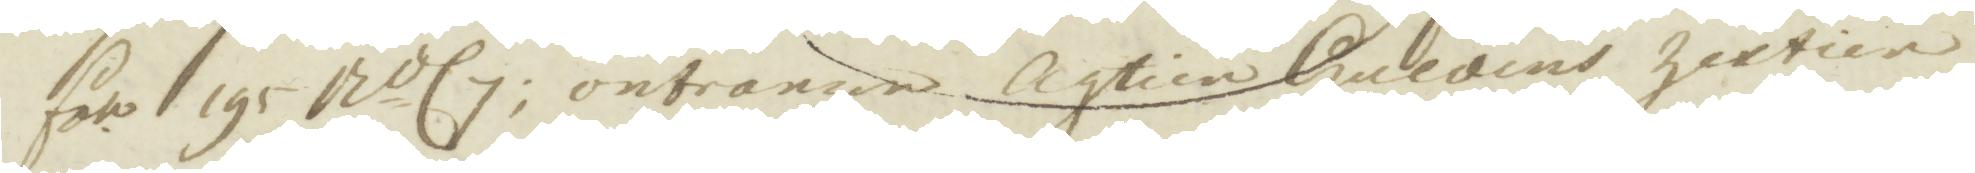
fak 195 N=o C7; ontvangen Agtien Guldens Zestien
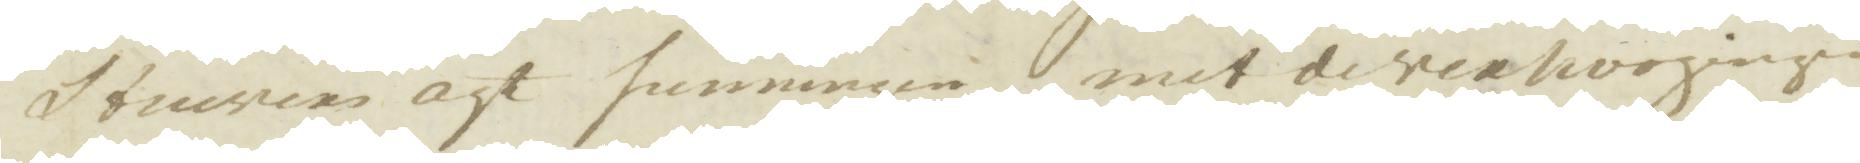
Stuivers agt penningen met de verhoogingen
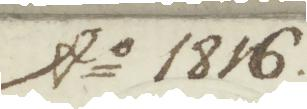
A=o 1816.
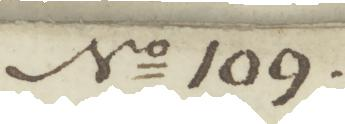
No 109
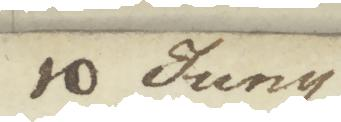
10 Iuny
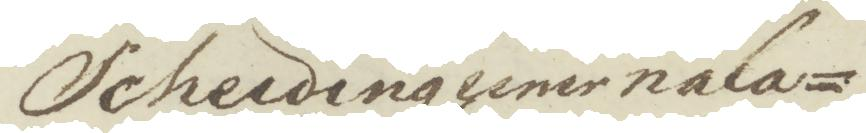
Scheiding eener nala=
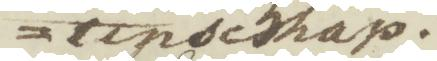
=tenschap.
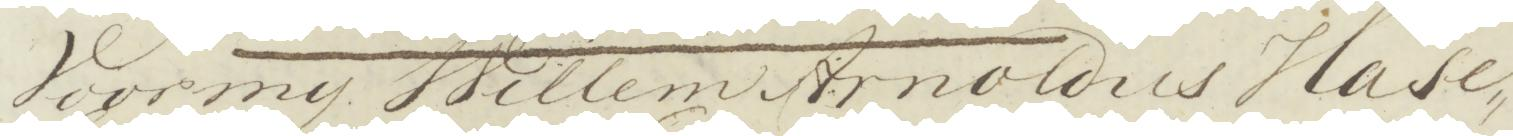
Voor my Willem Arnoldus Hase„
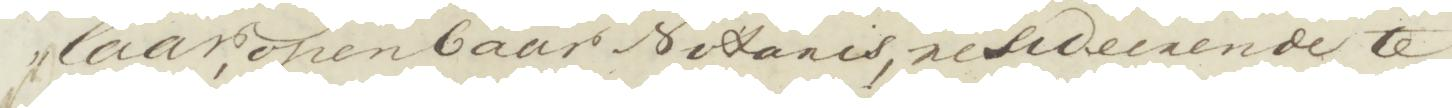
„laar, openbaar Notaris, resideerende te
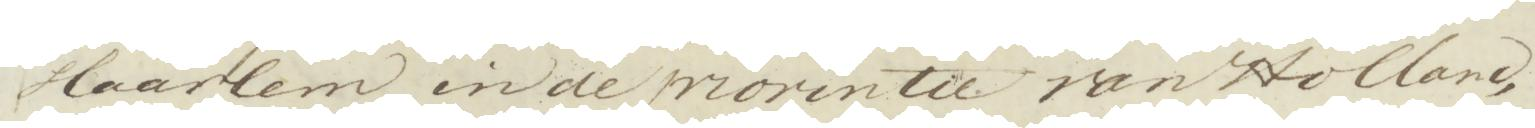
Haarlem in de provintie van Holland,
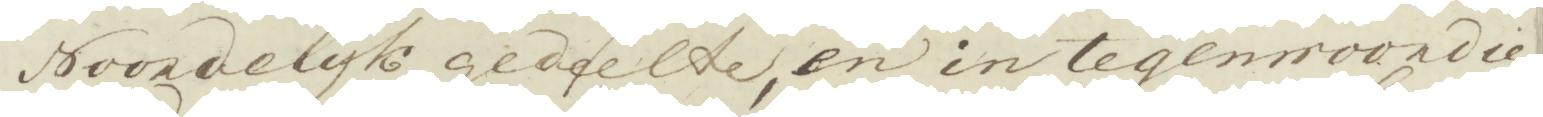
Noordelijk gedeelte, en in tegenwoordig
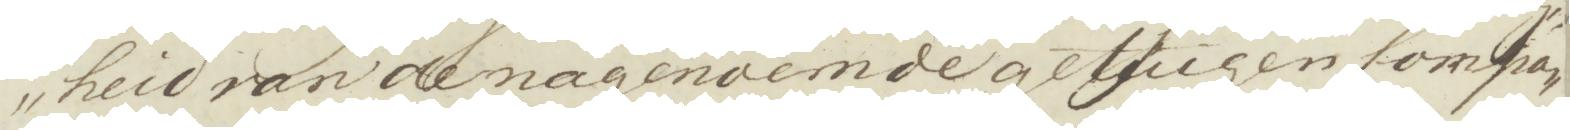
„heid van de nagenoemde getuigen Compa„
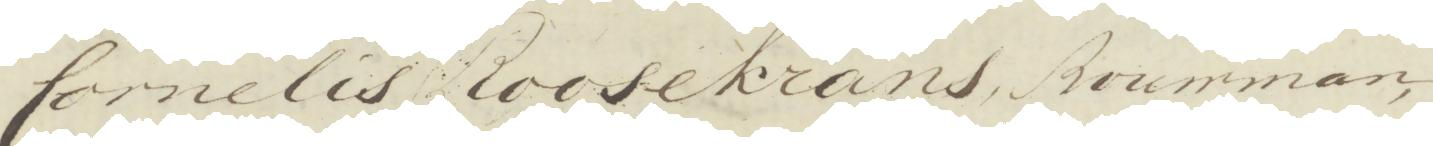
Cornelis Roosekrans, Bouwman,
